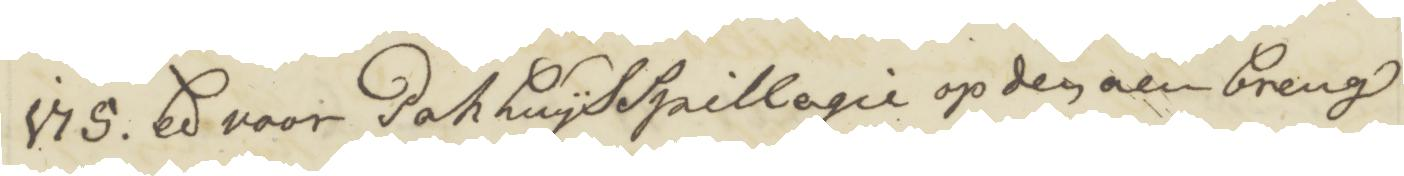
175. ed voor Pakhuijs spillagie op den aen breng
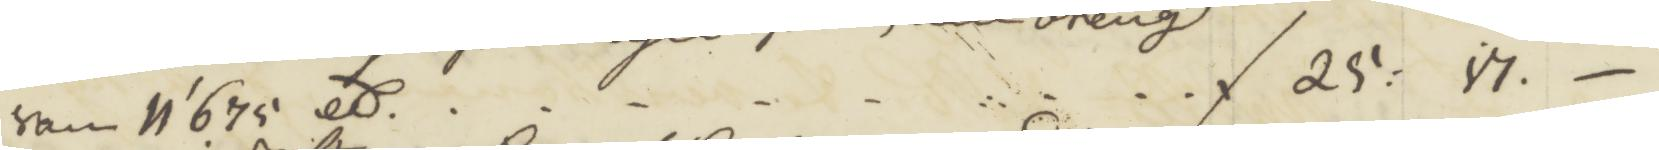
van 11'675 ed. . . . . . . . . . ƒ25: 17. —
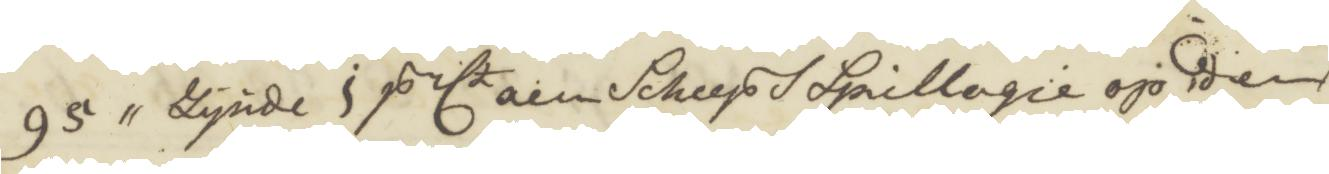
95 „ zijnde 1 prCt aen scheeps spillagie op den
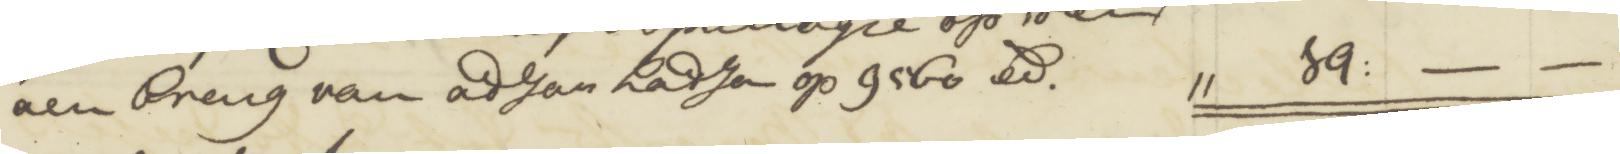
aen breng van adjarhadja op 9560 ed. „ 14: — —
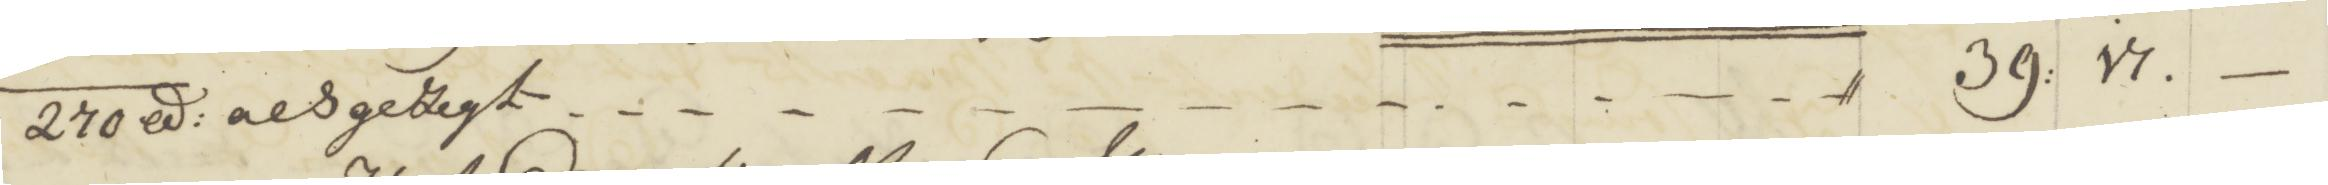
270 ed: als gezegt - - - - - - - - - - . - - - - - „ 39: 17. —
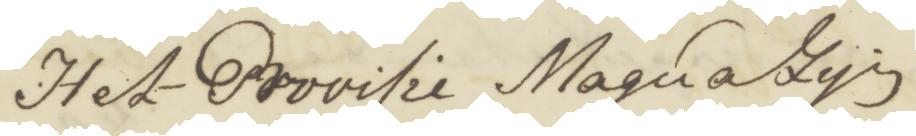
Het Provisie Maguazijn
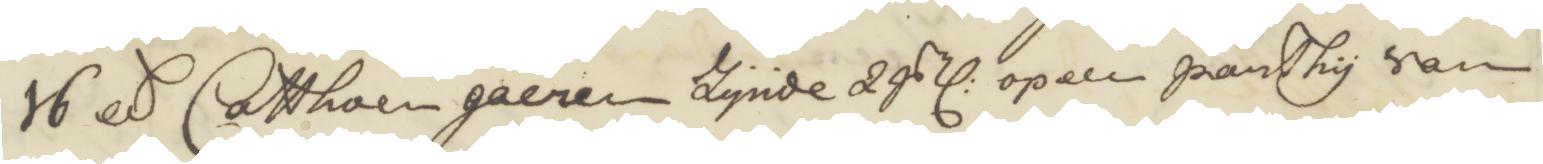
16 ed Catthoen gaeren zijnde 2 prC: op een parthij van
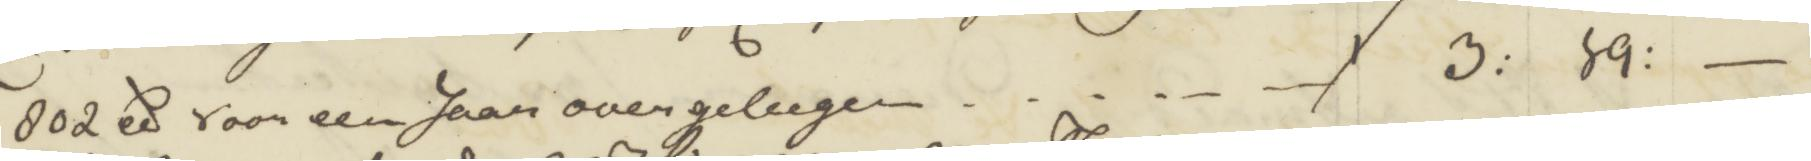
802 ed voor een Jaar overgeleegen . . . . - . . ƒ 3: 14: —
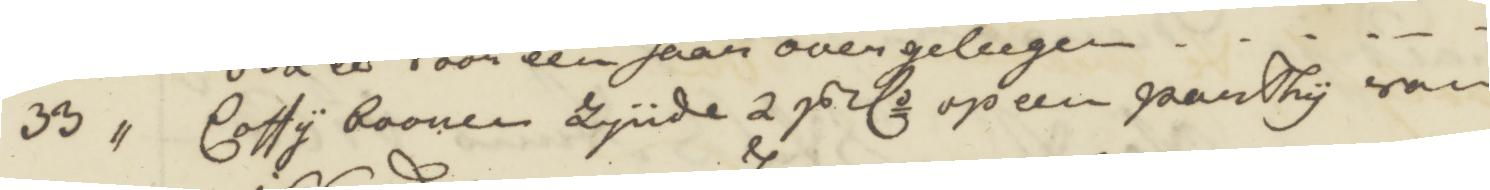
33 „ Coffij boonen zijnde 2 prC=o op een parthij van
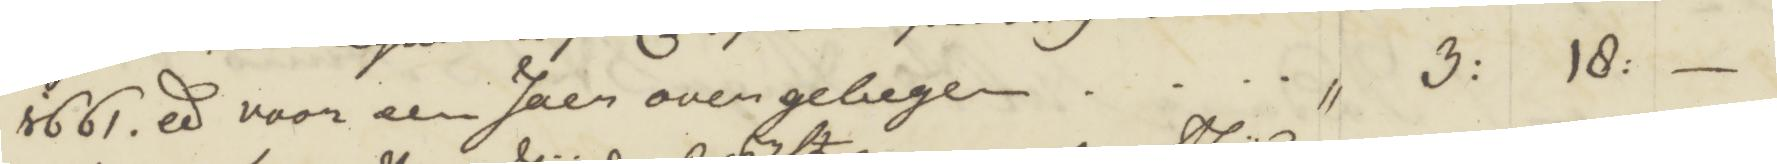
1661. ed voor een Jaer over geleegen . . . . „ 3: 18: —
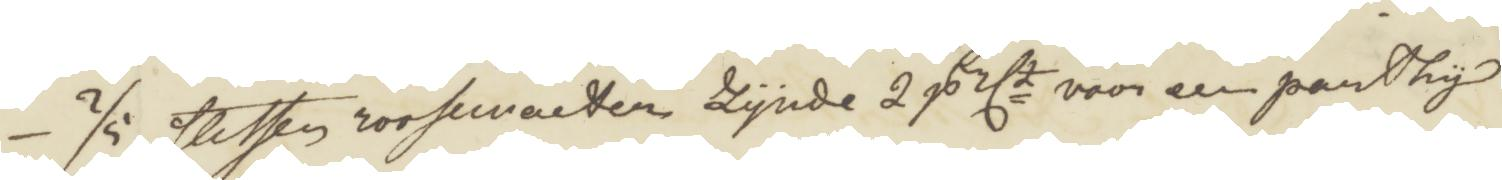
— 2/5 flessen roosewaeter zijnde 2 prC=t voor een parthij
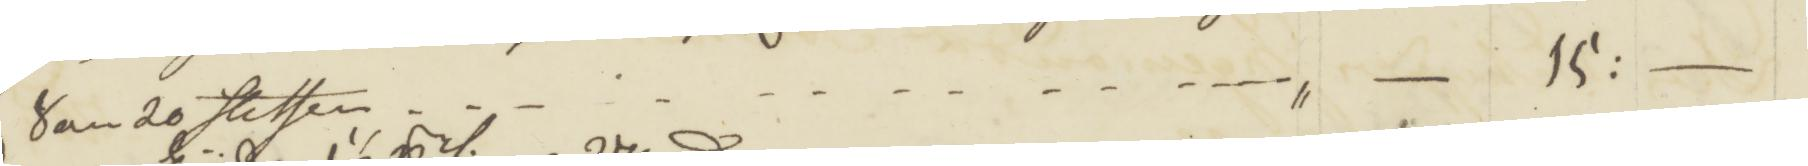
van 20 flessen - - - - - - - - - - - - - - - „ — 15:—
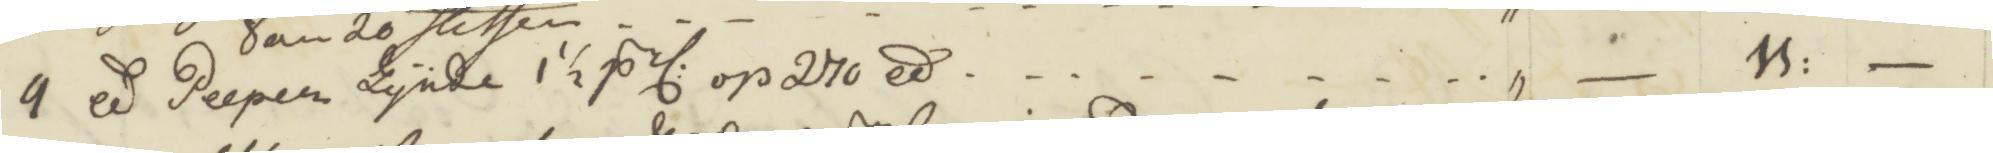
4 ed Peeper zijnde 1½ prC: op 270 ed - - . - - - - - . „ — 11: —
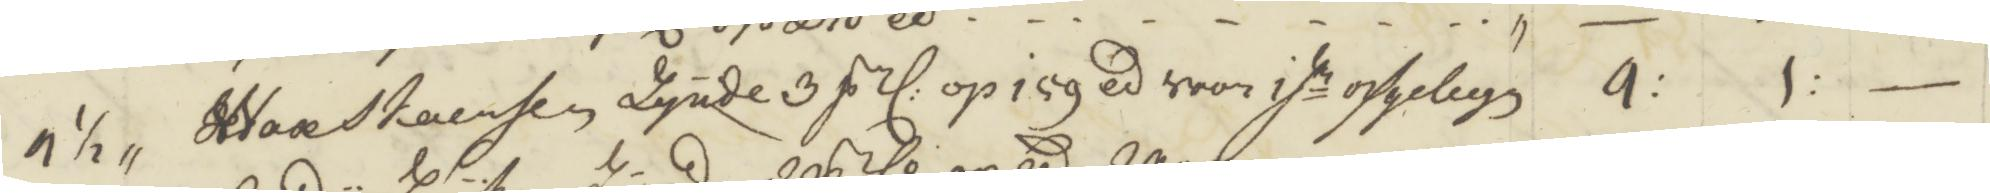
4½ „ Waxskaersen zijnde 3 prC: op 159 ed voor 1 J=r opgeleegen 4: 1: —
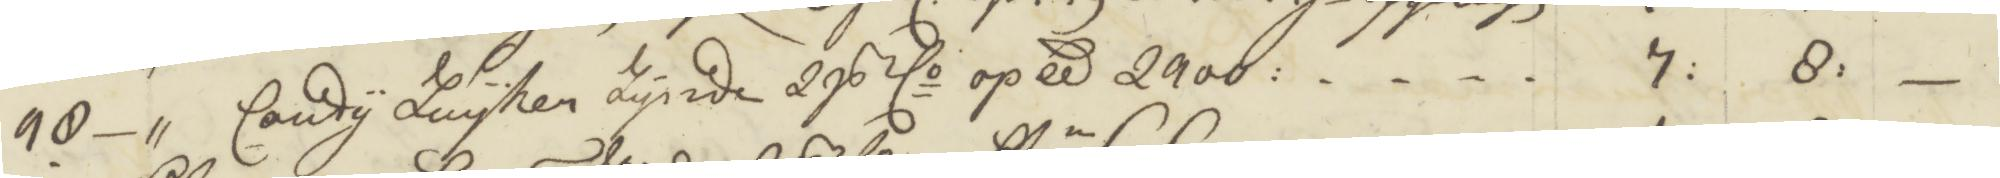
48—„ Candij zuijker zijnde 2 prC=o op ed 2400: - - - . 7: 8: —
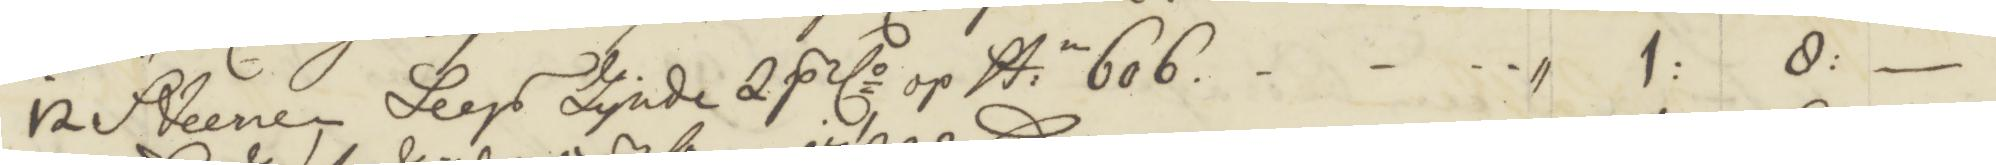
12 steenen seep zijnde 2 prC=o op H:r 606. - - - - „ 1: 8: —
